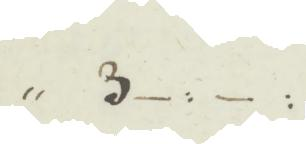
„ 3 —: —:
